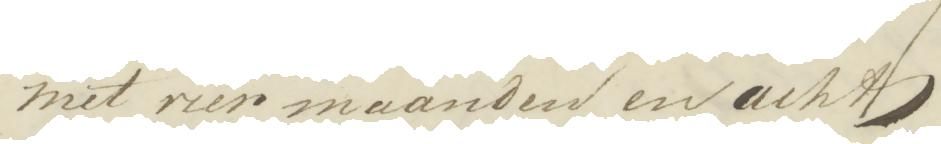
met vier maanden en acht
